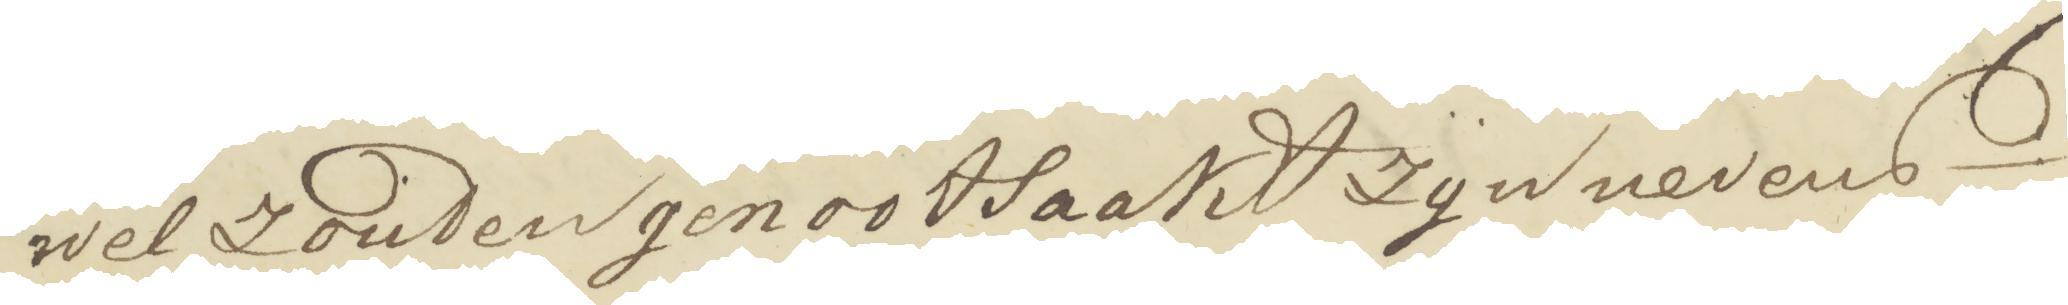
wel Zouden genootsaakt Zijn nevens -
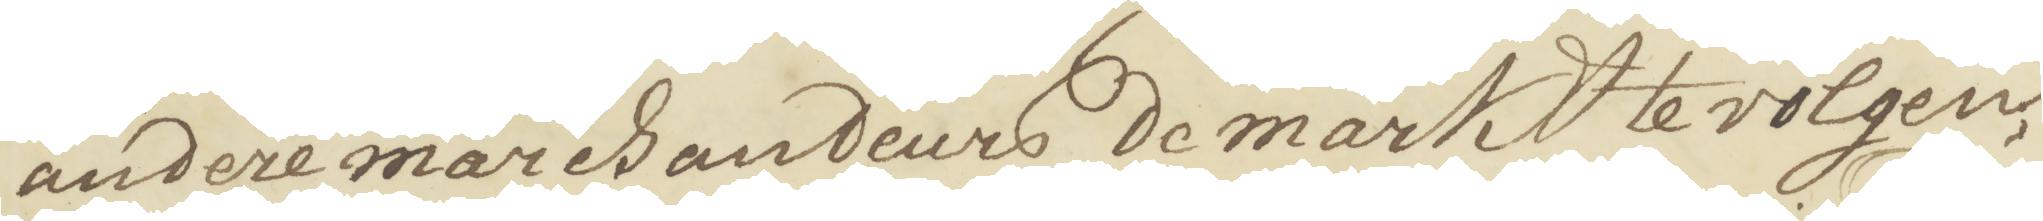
andere marchandeurs de markt te volgen,
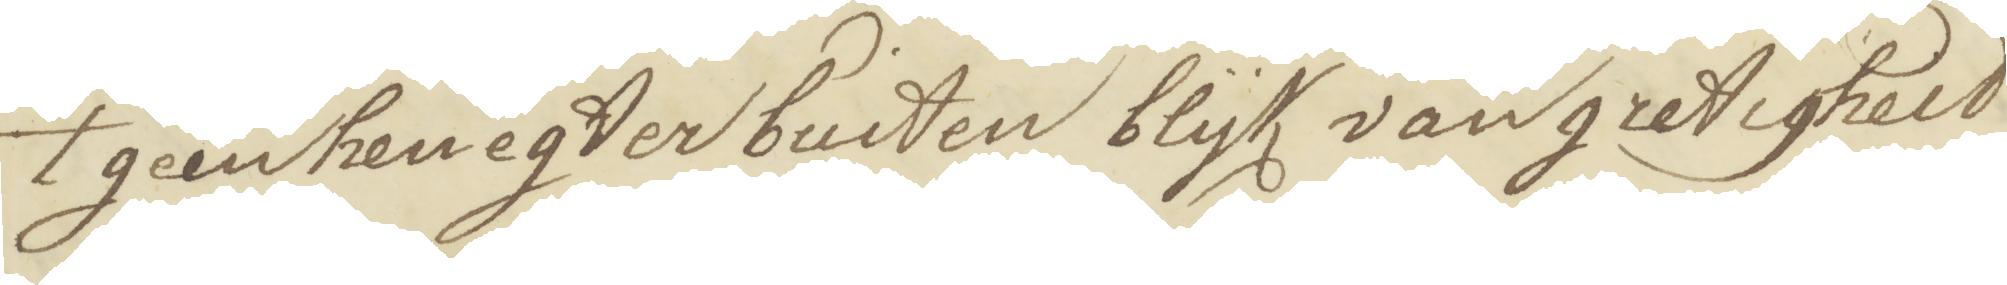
't geen hen egter buiten blijk van gretigheid
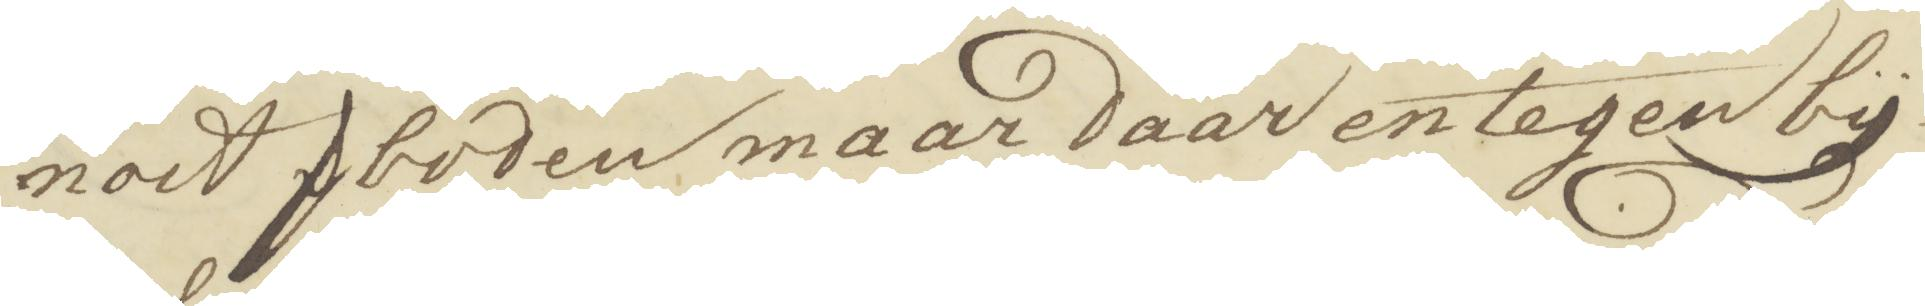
noit verboden maar daar en tegen bij
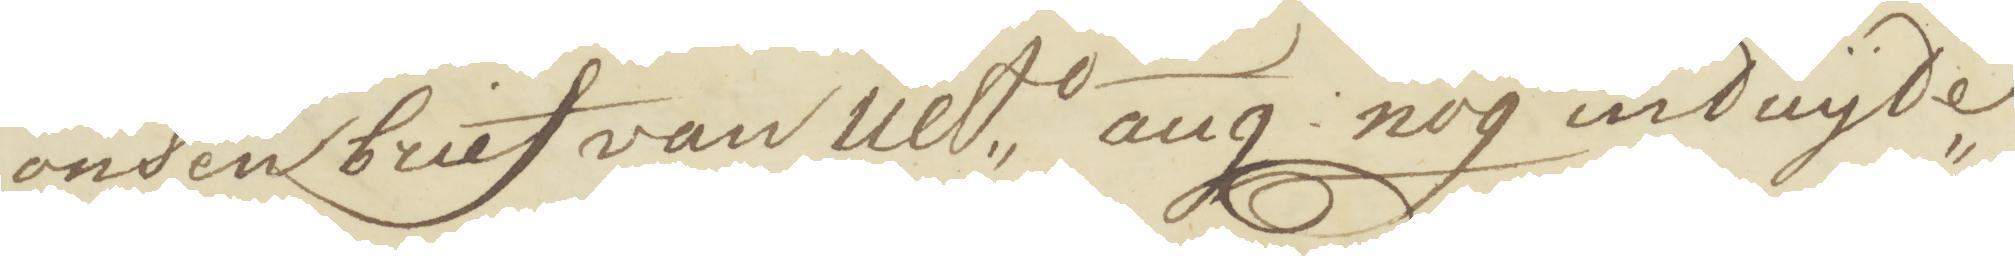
onsen brief van Ult„o aug: nog in duijde„
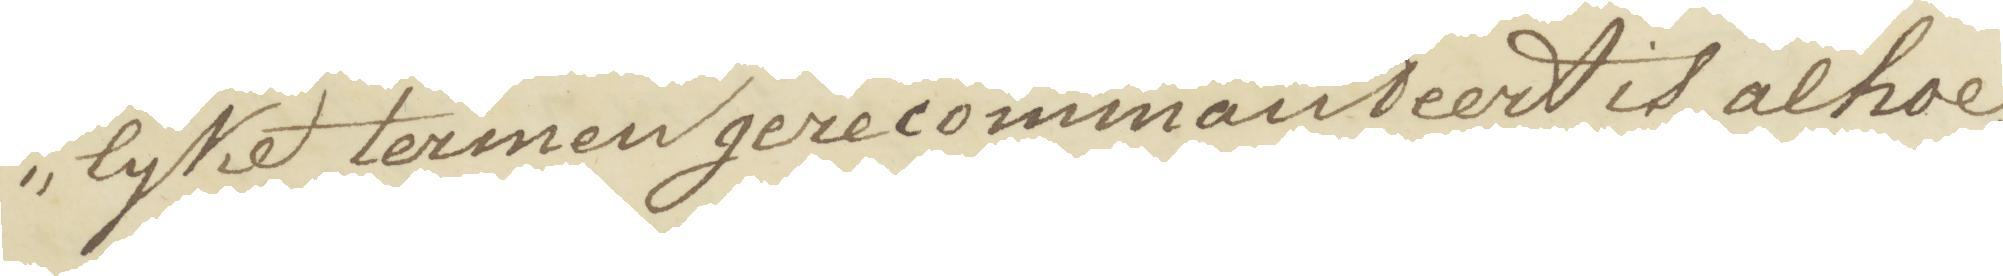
„lijke termen gerecommandeert is alhoe„
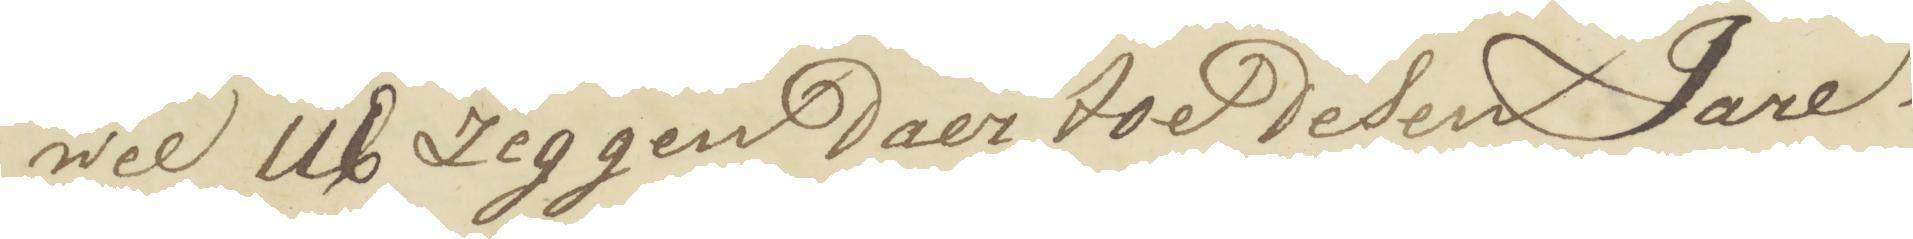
wel UE zeggen daer toe desen Iare.
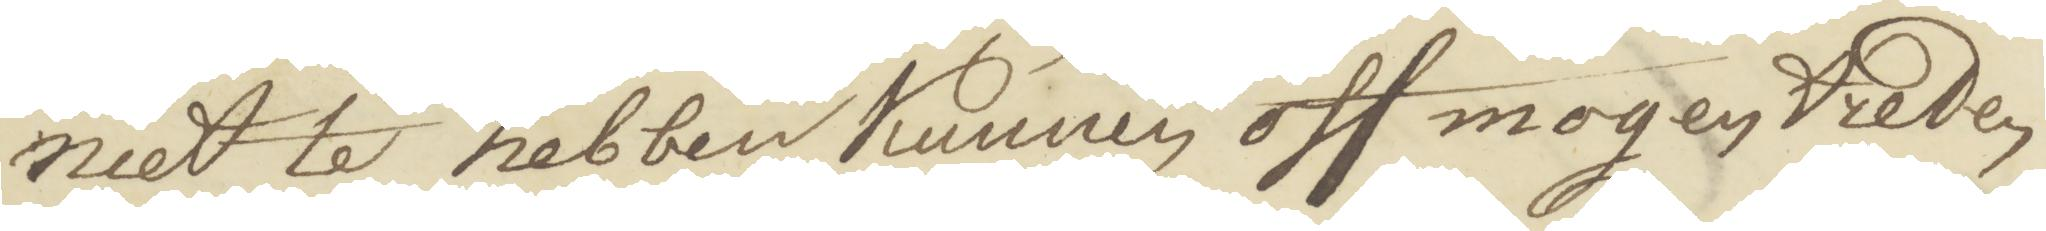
niet te hebben kunnen off mogen treden
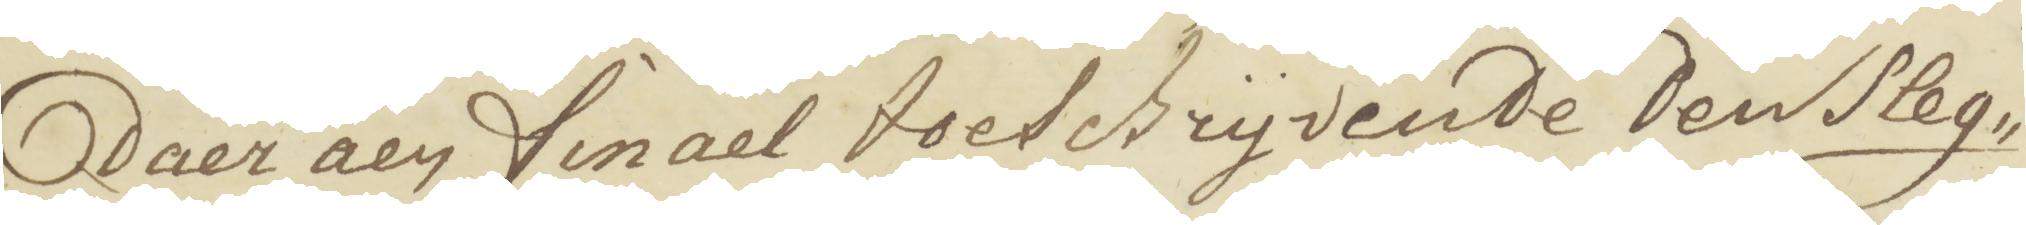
daer aen finael toeschrijvende den Sleg„
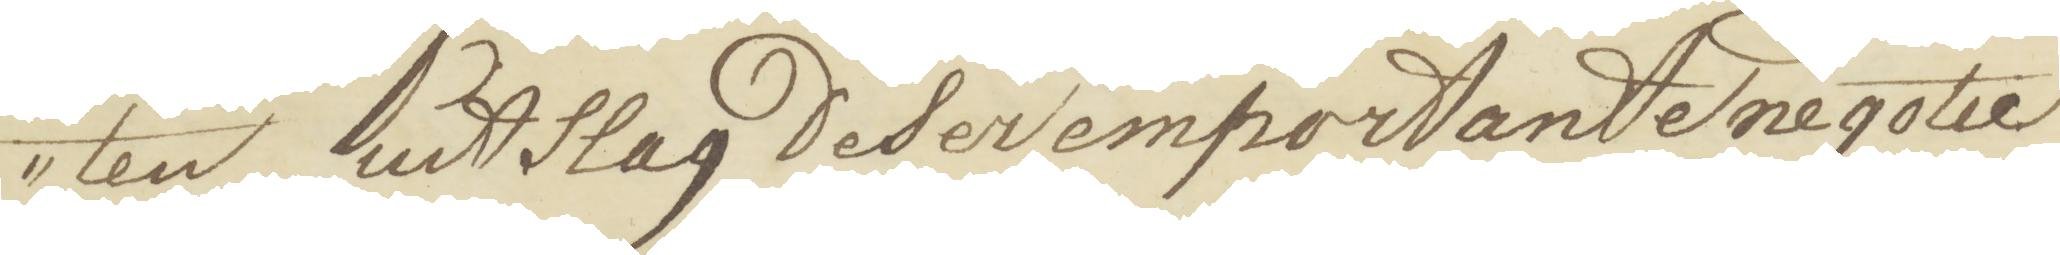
„ten uitslag Deser emportante negotie
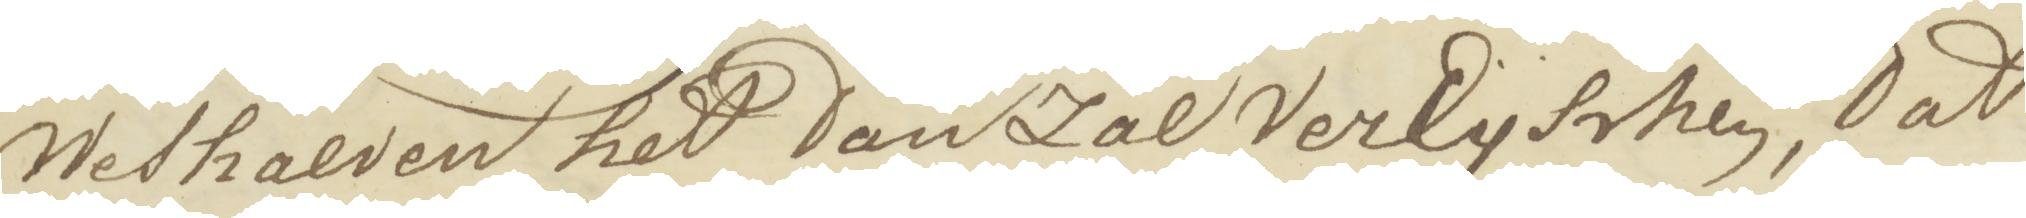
Weshalven het dan zal vereijschen, dat
